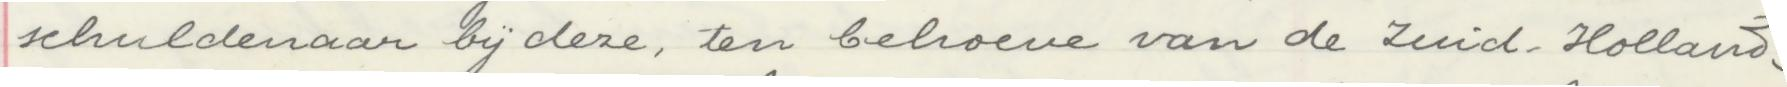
schuldenaar bij deze, ten behoeve van de zuid - Holland
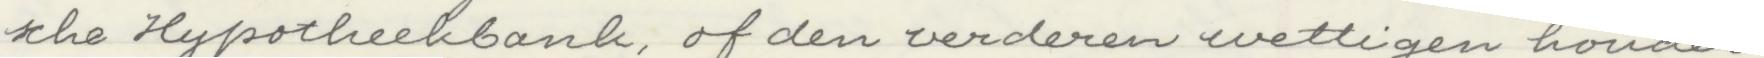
sche Hypotheekbank, of den verderen wettigen houder
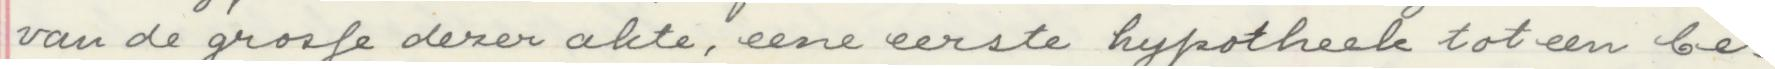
van de grosse dezer akte, eene eerste hypotheek tot een be-
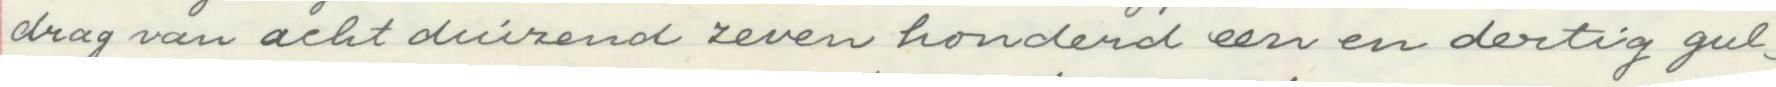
drag van acht duizend zeven honderd een en dertig gul
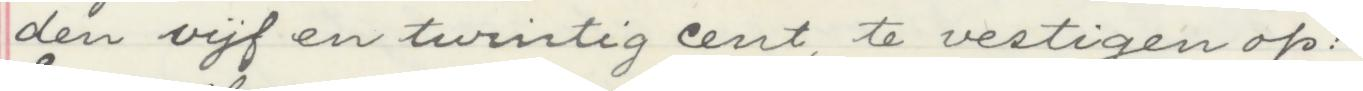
den vijf en twintig cent, te vestigen op:
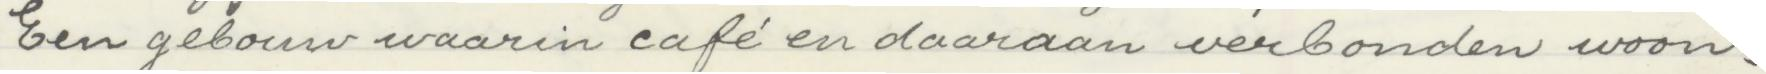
Een gebouw waarin café en daaraan verbonden woon-
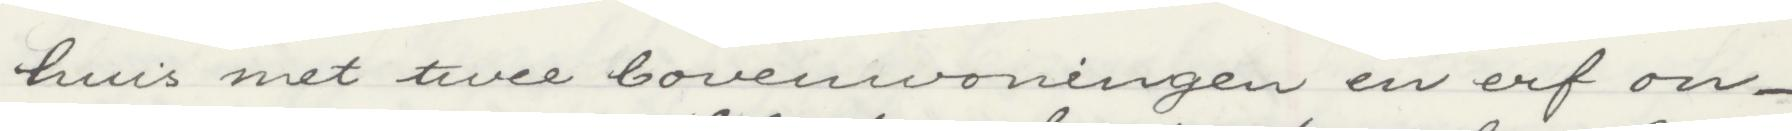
huis met twee bovenwoningen en erf on-
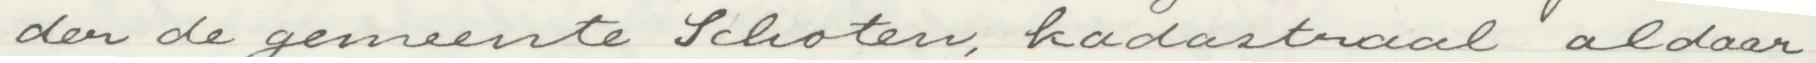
der de gemeente Schoten, kadastraal aldaar
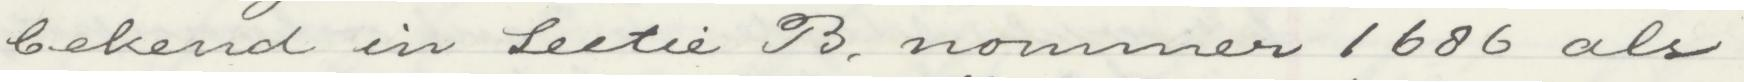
bekend in sectie B. nommer 1686 als
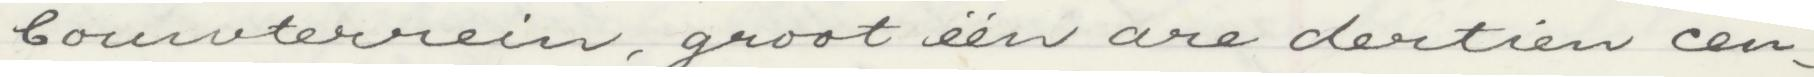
bouwterrein, groot één are dertien cen-
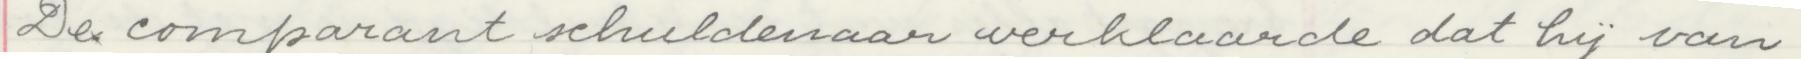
De comparant schuldenaar verklaarde dat hij van
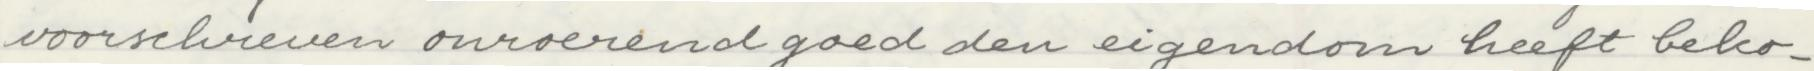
voorschreven onroerend goed den eigendom heeft beko-
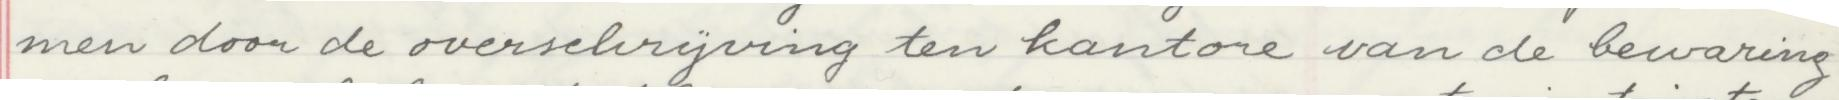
men door de overschrijving ten kantore van de bewaring
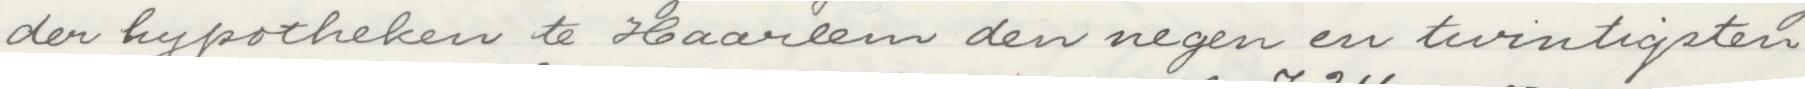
der hypotheken te Haarlem den negen en twintigsten
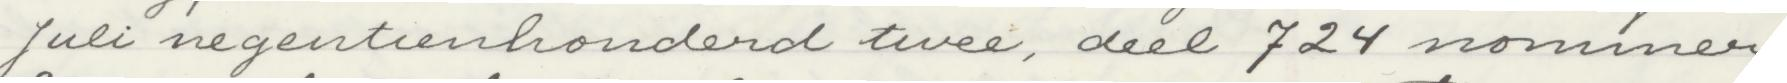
Juli negentienhonderd twee, deel 724 nommer
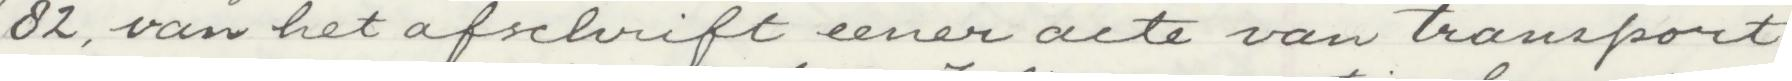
82, van het afschrift eener acte van transport
